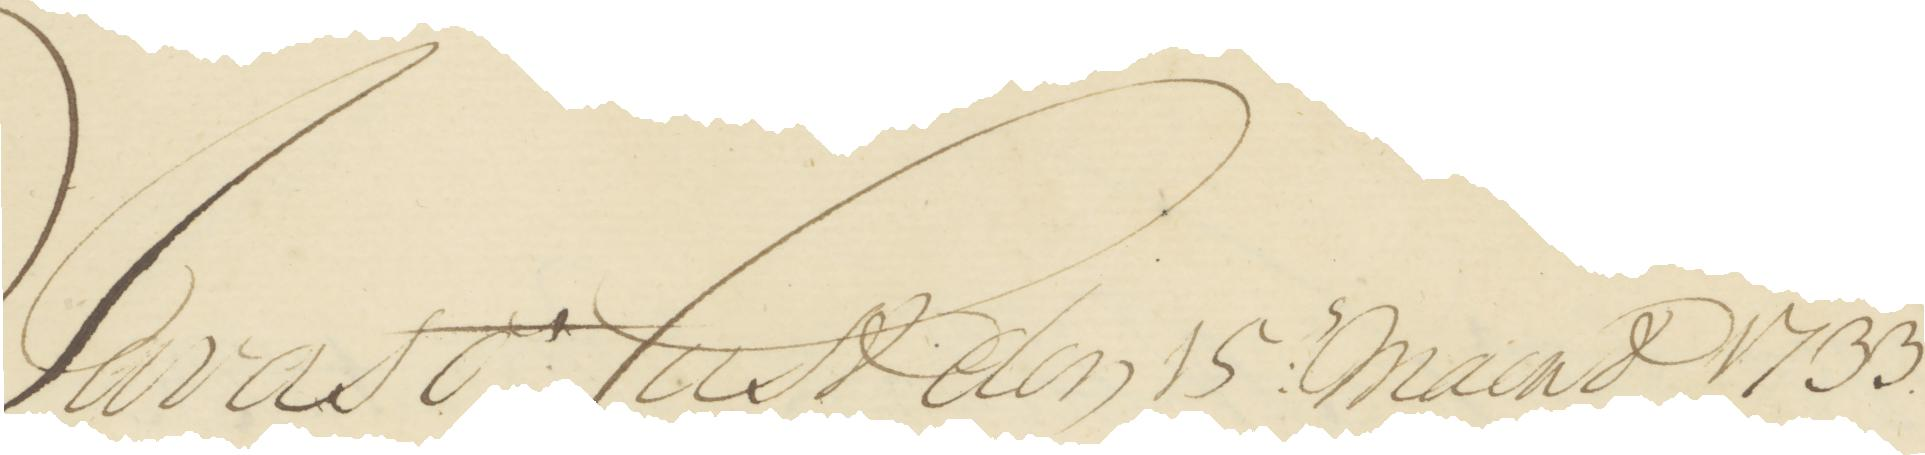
Javas o:t cust den 15: ' maerd 1733.
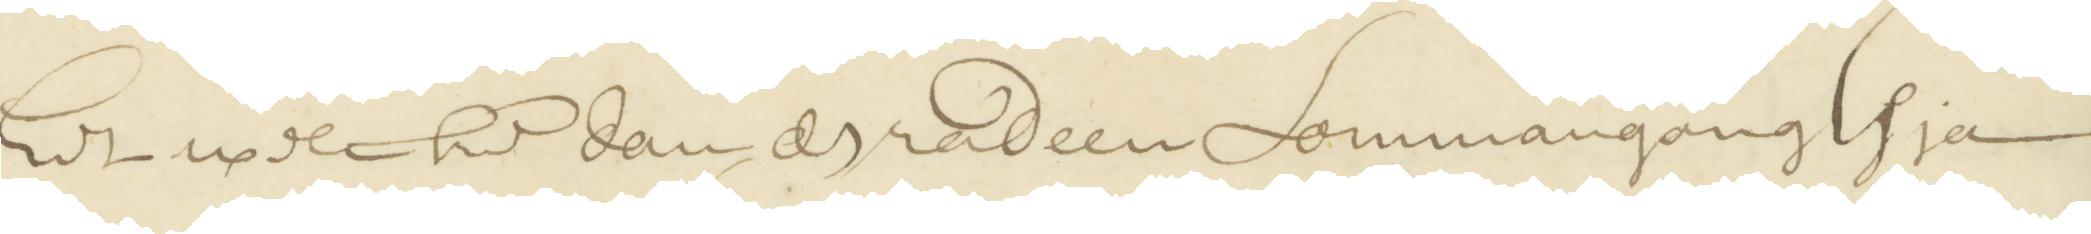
het welcke dan den radeen Tommongong Thja
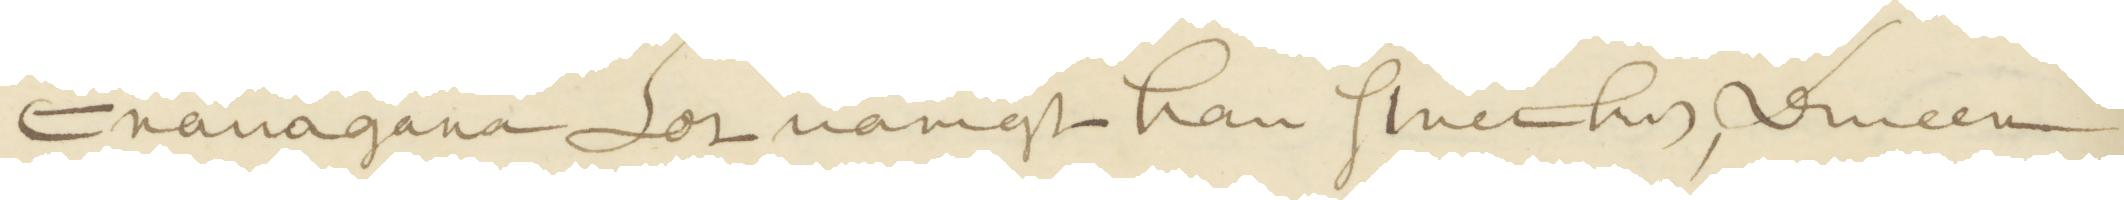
Cranagara Tot narigt kan strecken, Temeer
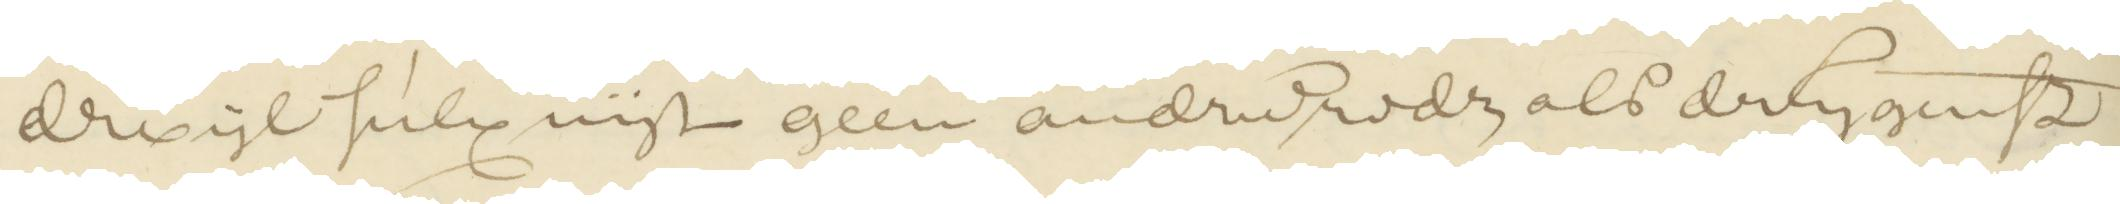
dewijl sulx uijt geen andere reden als de Eygenst
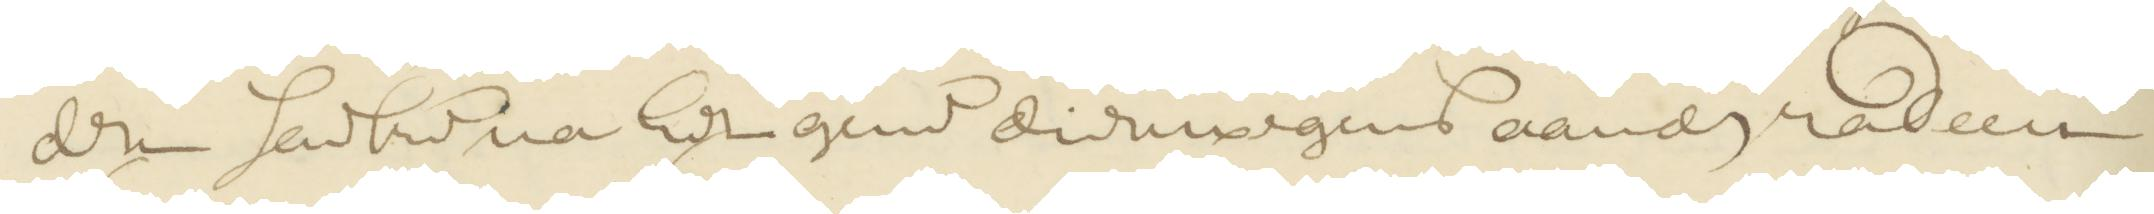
der saeke na het gene dienwegens aan den radeen
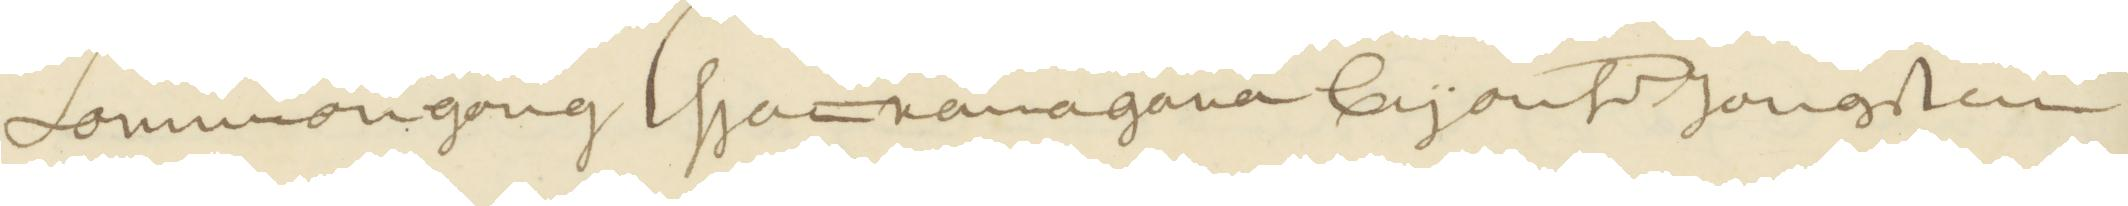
Tommongong Tsjacranagara bij onse jongsten
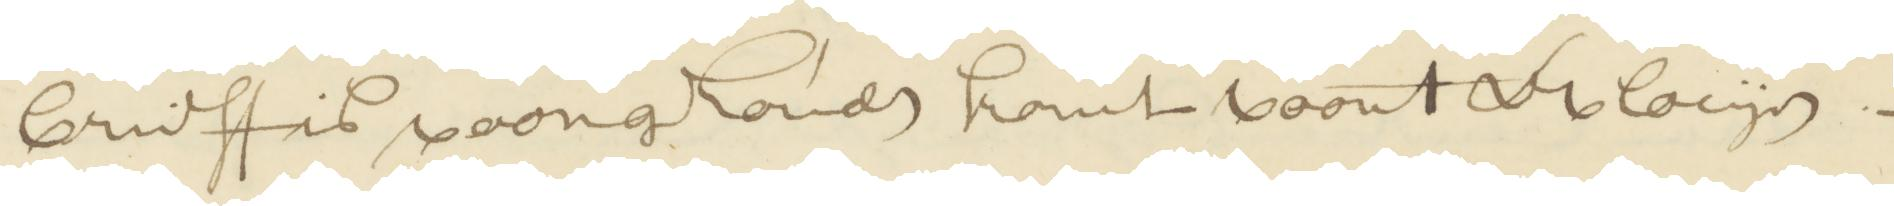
brieff is voor gehouden komt voort tevloeijen
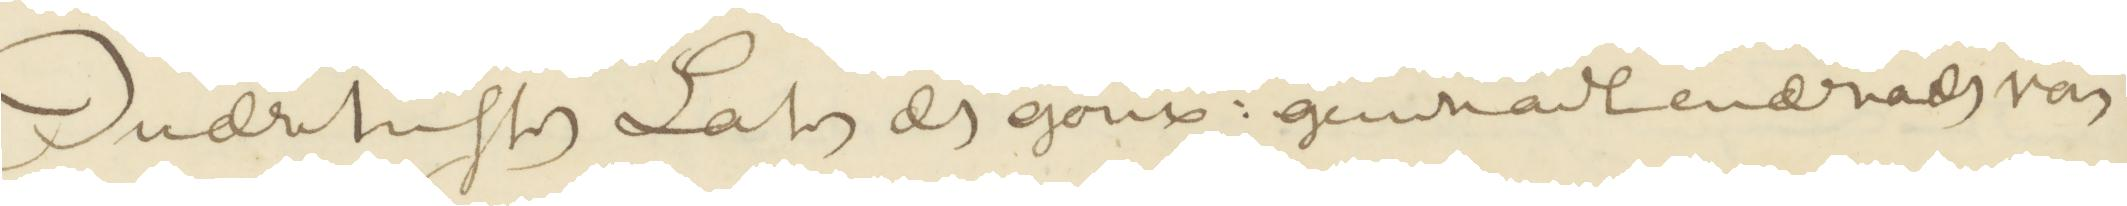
Ondertussen Laten den gouv: r generael ende raden van
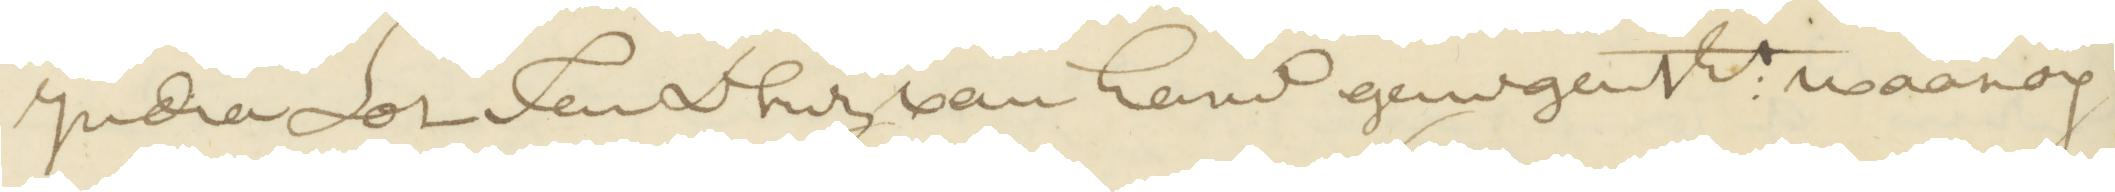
Jndia Tot Een teken van hare genegenth:t waarop
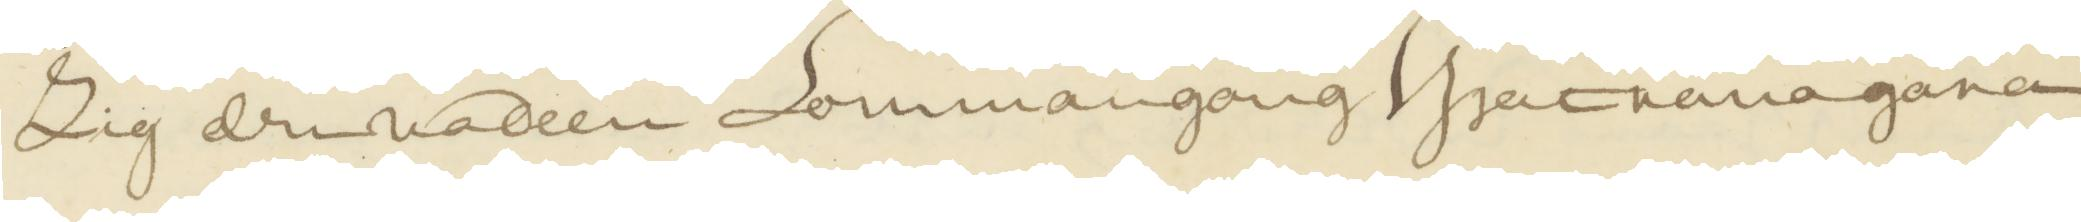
Zig den radeen Tommongong Tsjacranagara
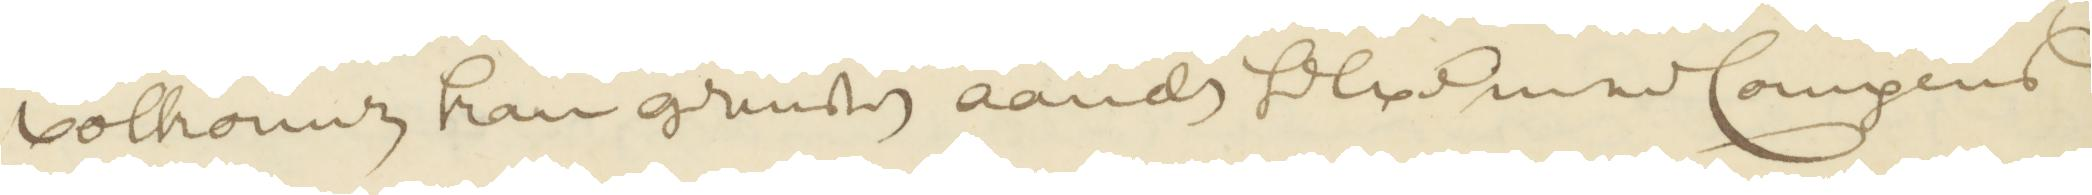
volkomen kan gerusten aanden selve inre Compens
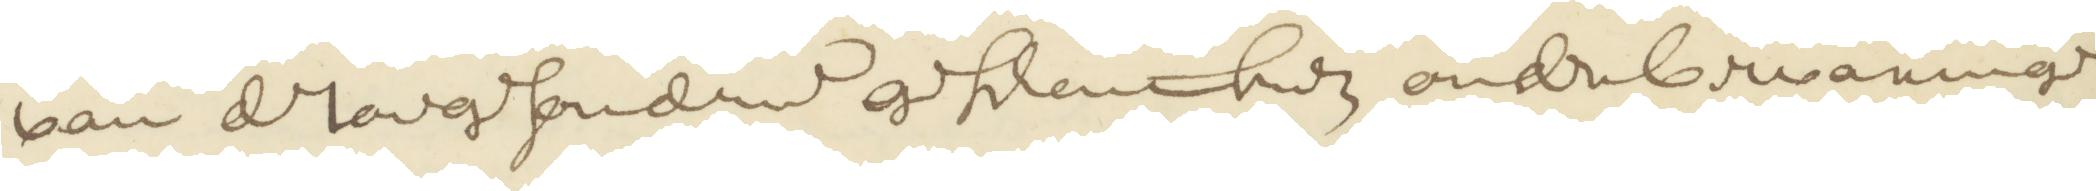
van de toegesonden geschencken onder bewaringe
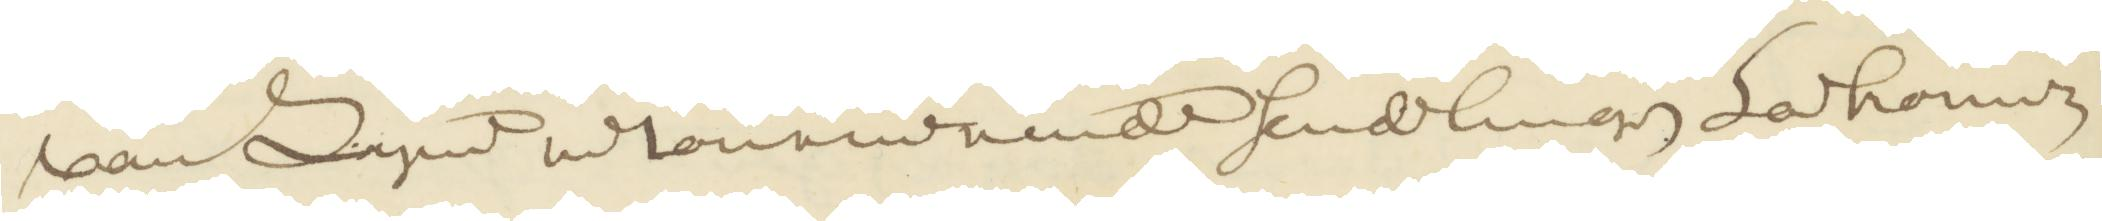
van Zijne retournerende sendelingen toekomen
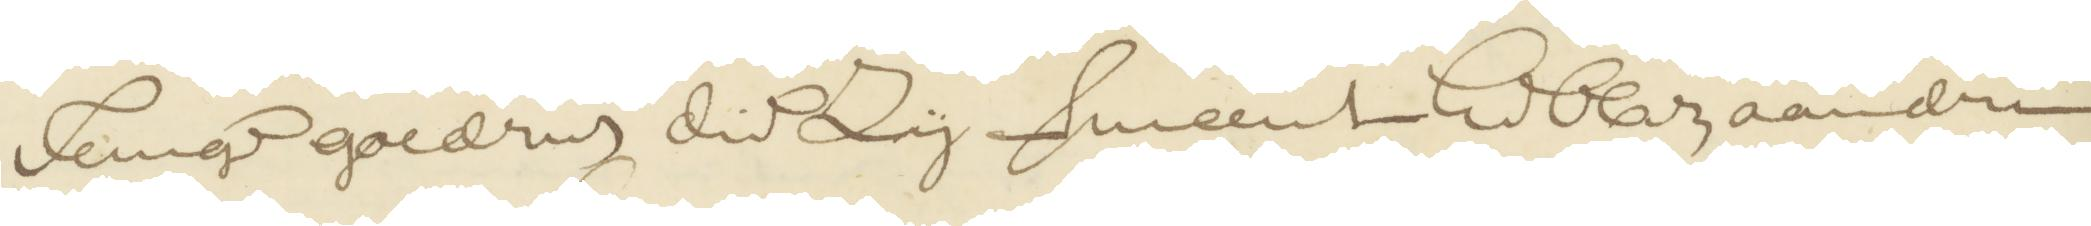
Eenige goederen die Zij vermeent hebben aanden
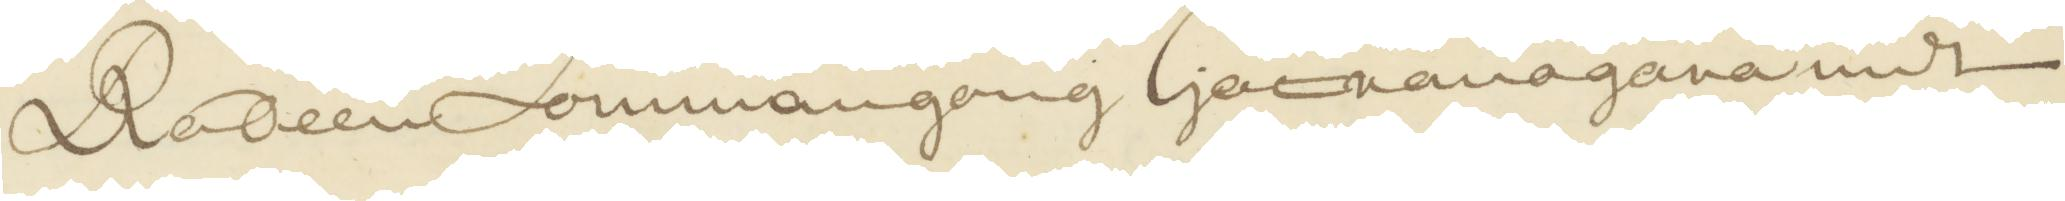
Radeen Tommongong Tjacranagara niet
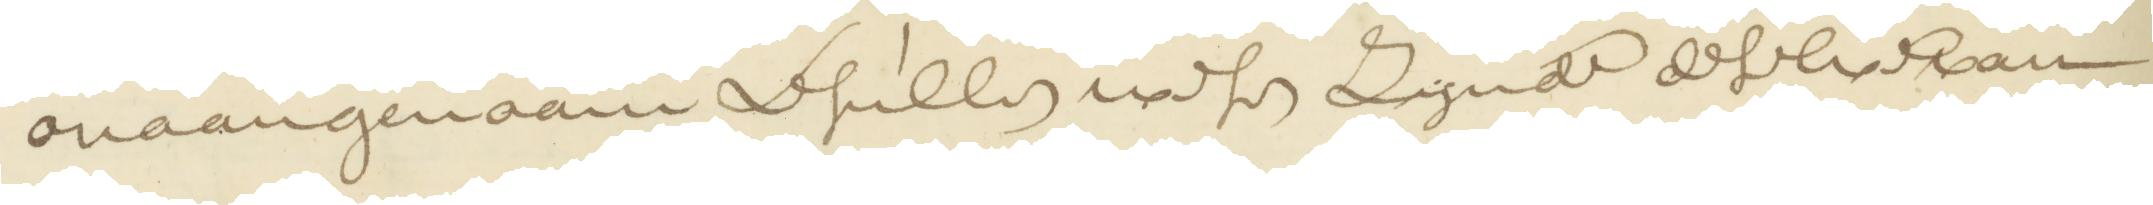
onaangenaam tesullen wesen Zijnde deselve van
